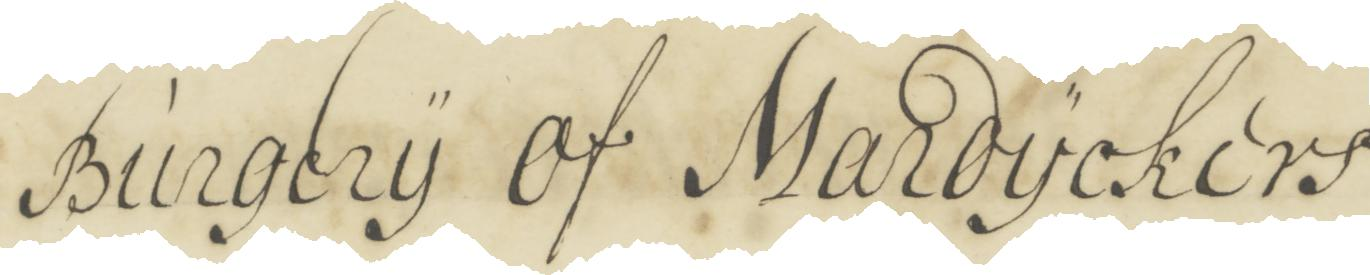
Burgerij of Mardijckers
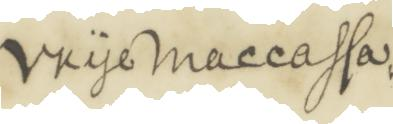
vrije maccassa
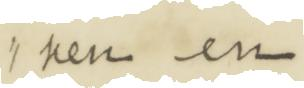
„ren en
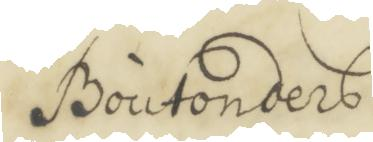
Boutonders
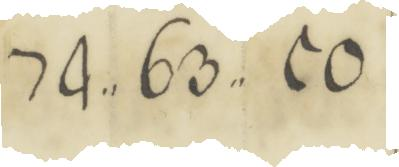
74„63„ 50
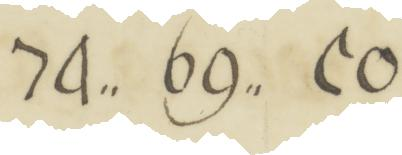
74„ 69„ 50
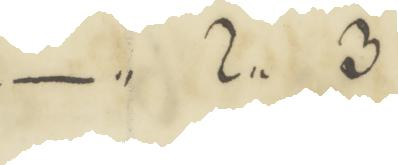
—„ 2„ 3
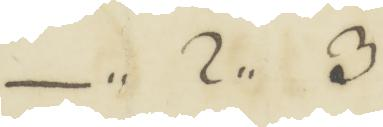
— „ 2„ 3
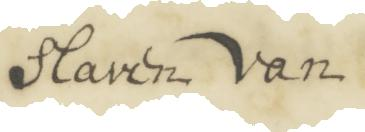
slaven van
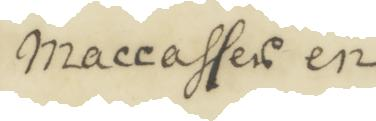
Maccassers en
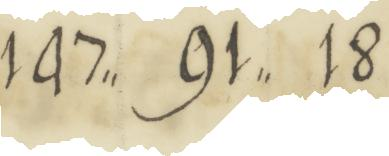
147„ 91„ 18
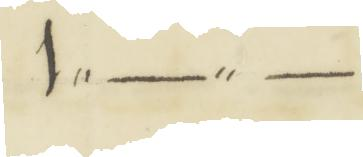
1„ —„ —
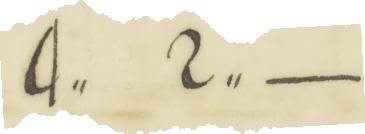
4„ 2„ —
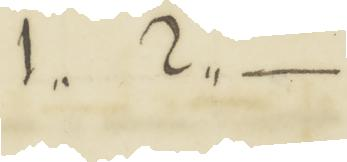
1„ 2„ —
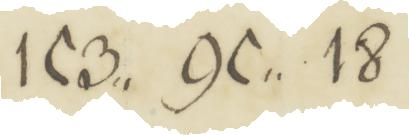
153„ 95„ 18
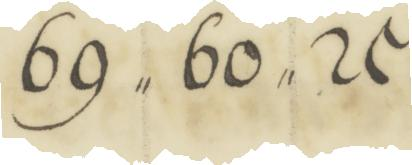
69„ 60„ 25
